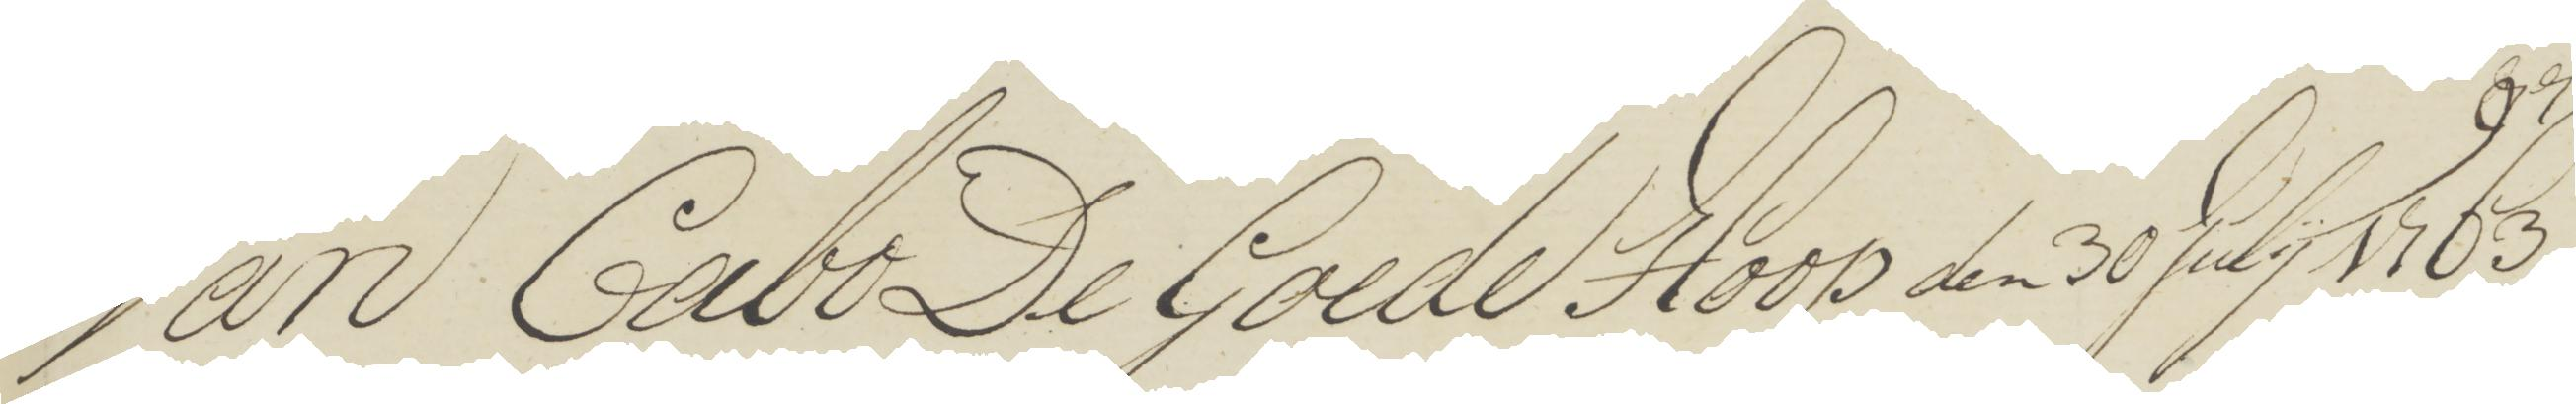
Van Cabo De Goede Hoop den 3 Julij 1763,
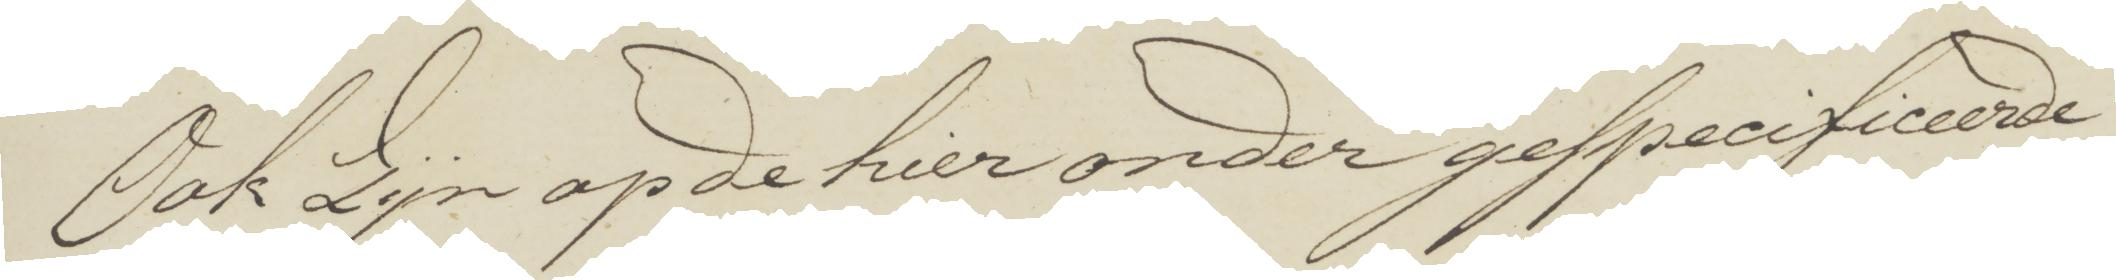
Ook zijn op de hier onder gespecificeerde
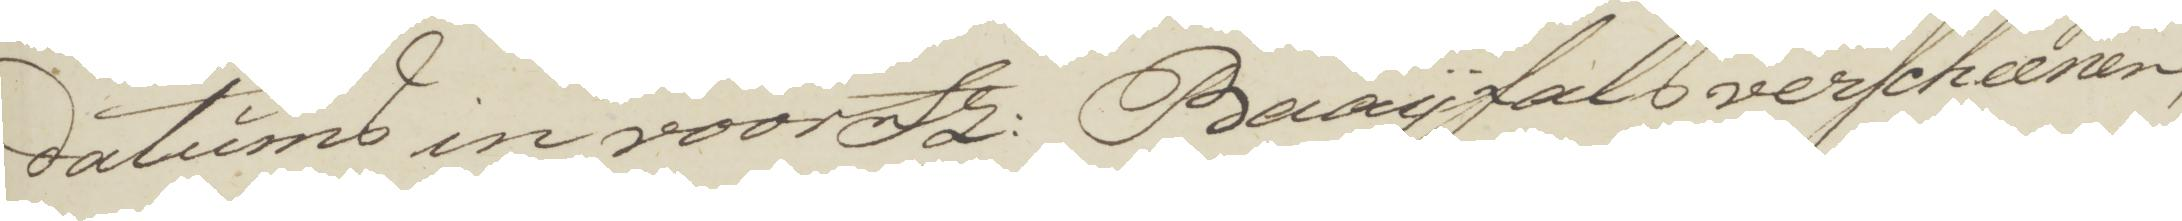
datums in voorsz: Baaij fals verscheenen
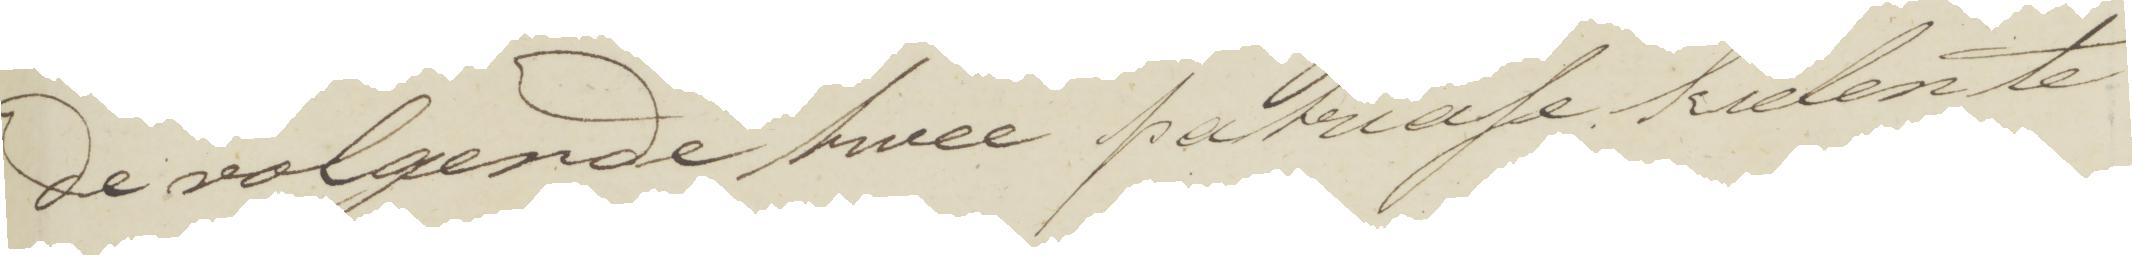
de volgende twee patriase kielen te
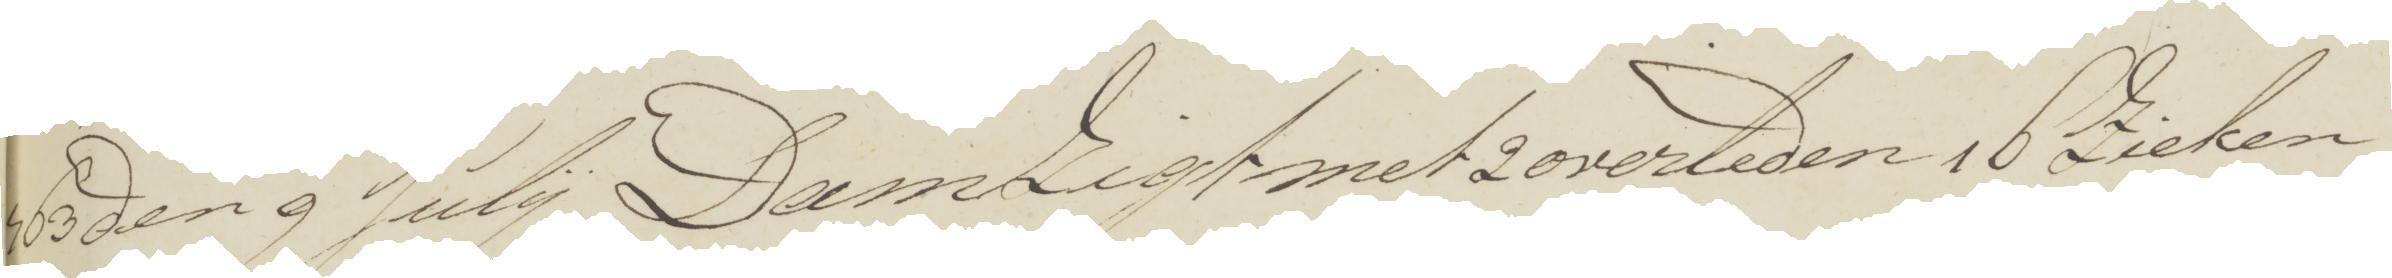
763 den 9 Julij Damzigt met 2 overleden 16 zieken
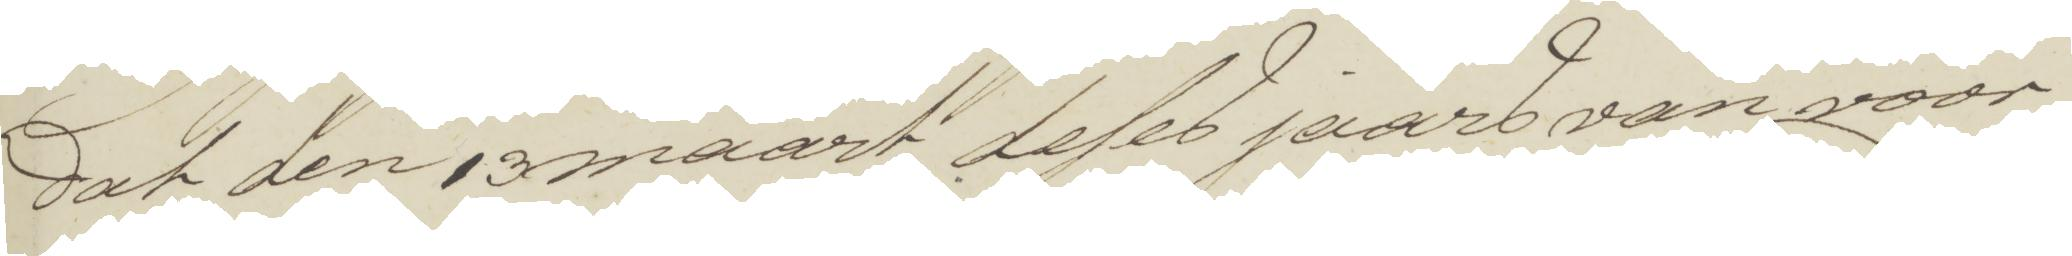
dat den 13 maart deses jaars van voor
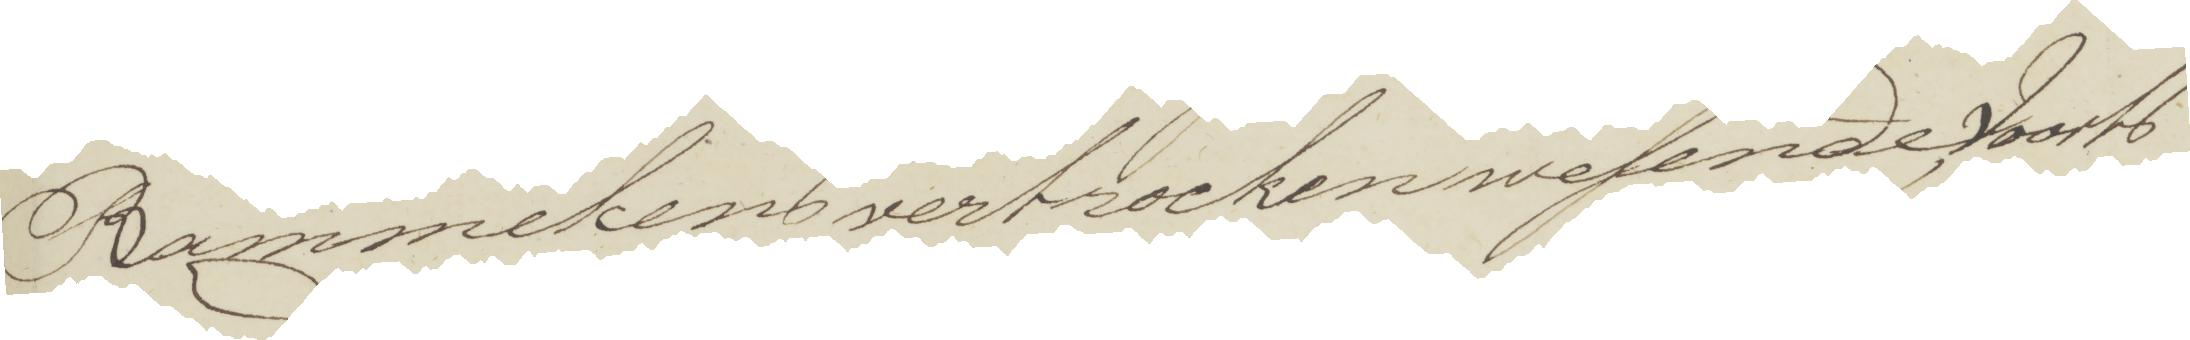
Rammekens vertrocken wesende voorts
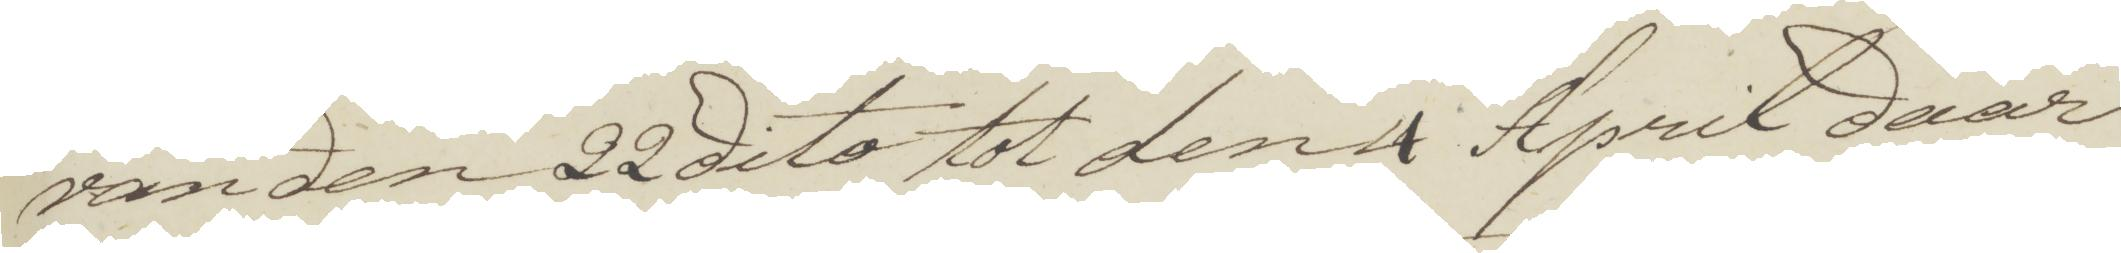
van den 22 dito tot den 4 April daar
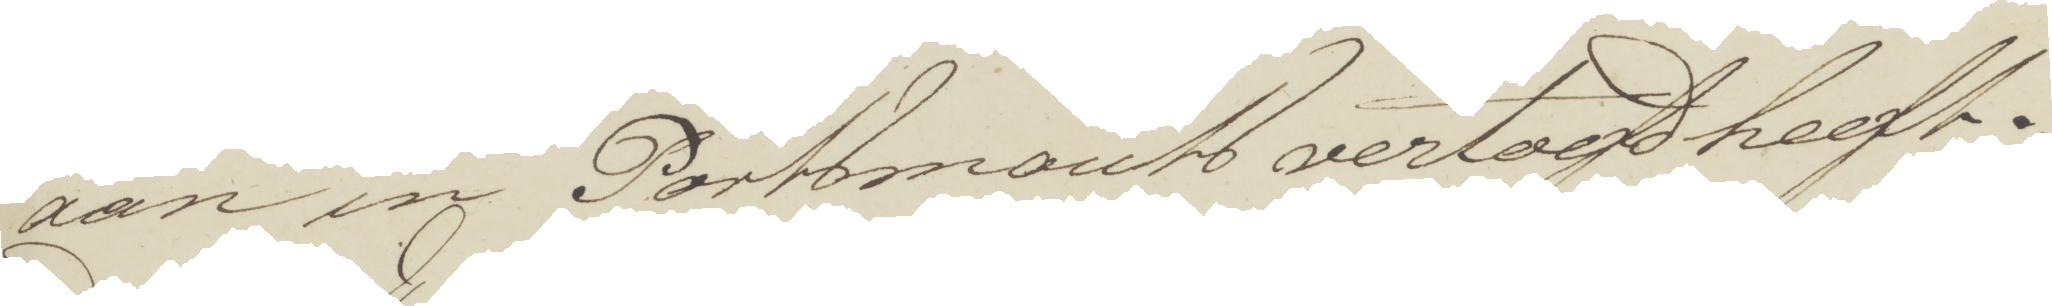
aan in Portomauts vertoefd heeft.
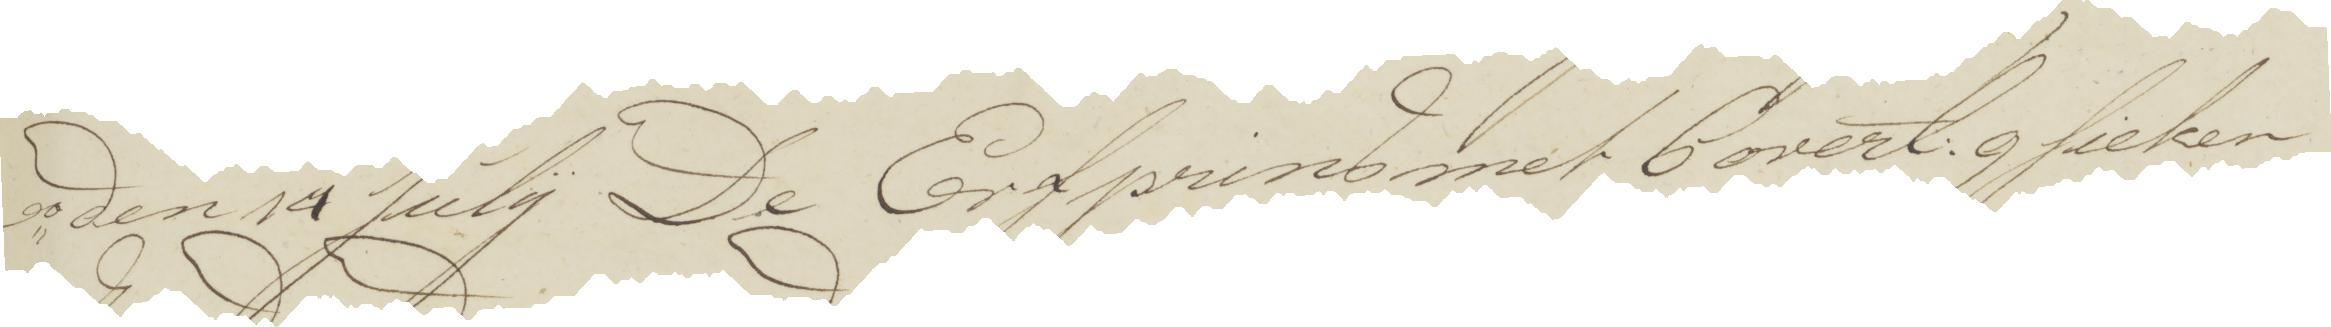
_„o den 14 Julij De Erfprins met 6 overl: 9 sieken
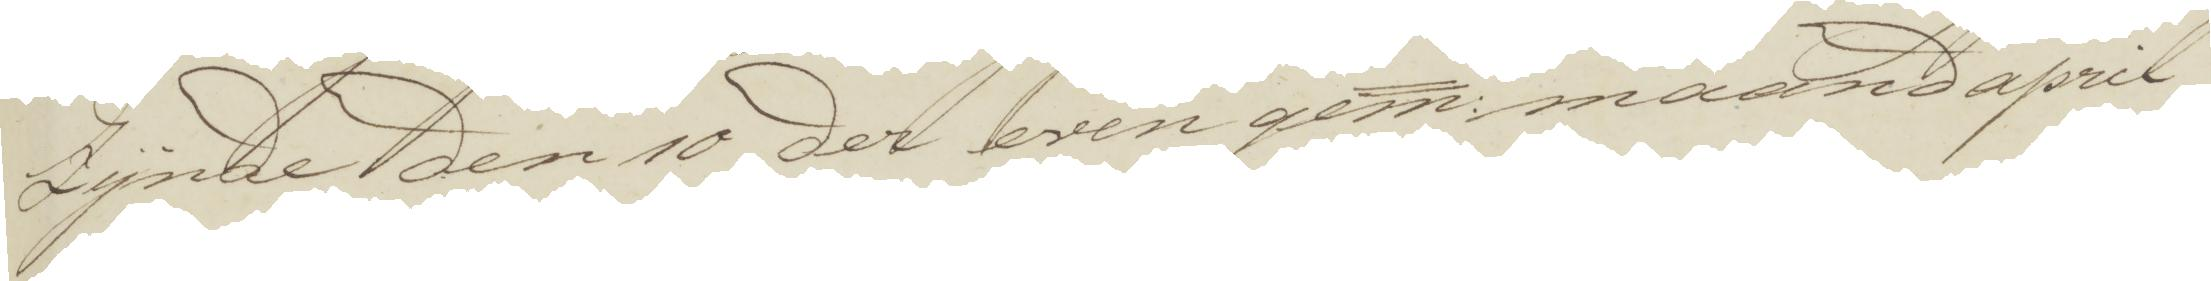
zijnde den 10 der even gem: maand april
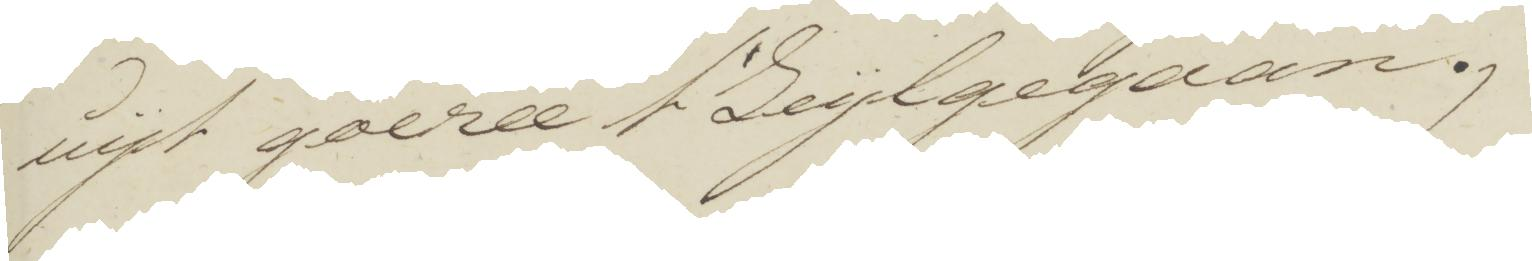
uijt goeree t' zeijlgegaan.,
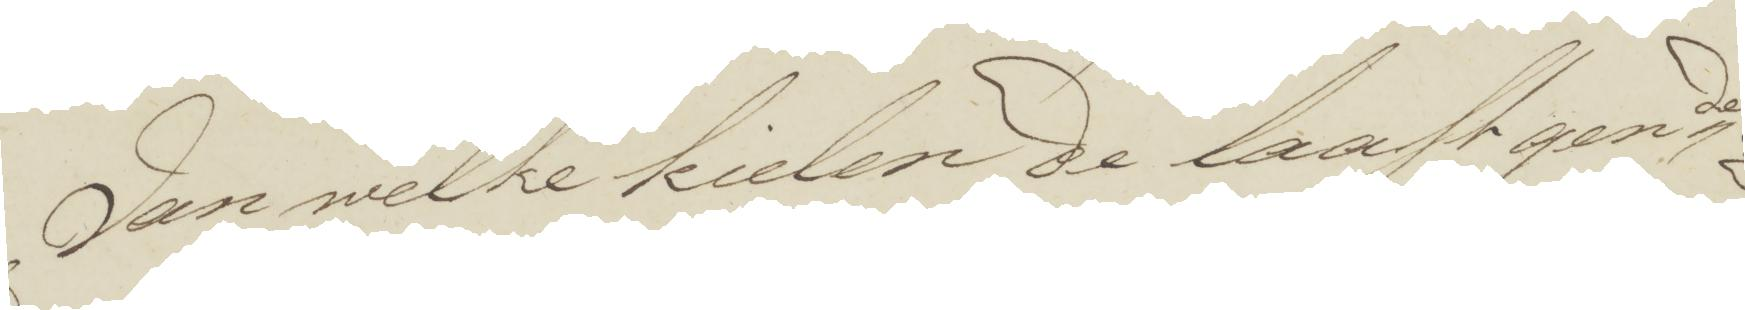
Van welke kielen de laast gen„de
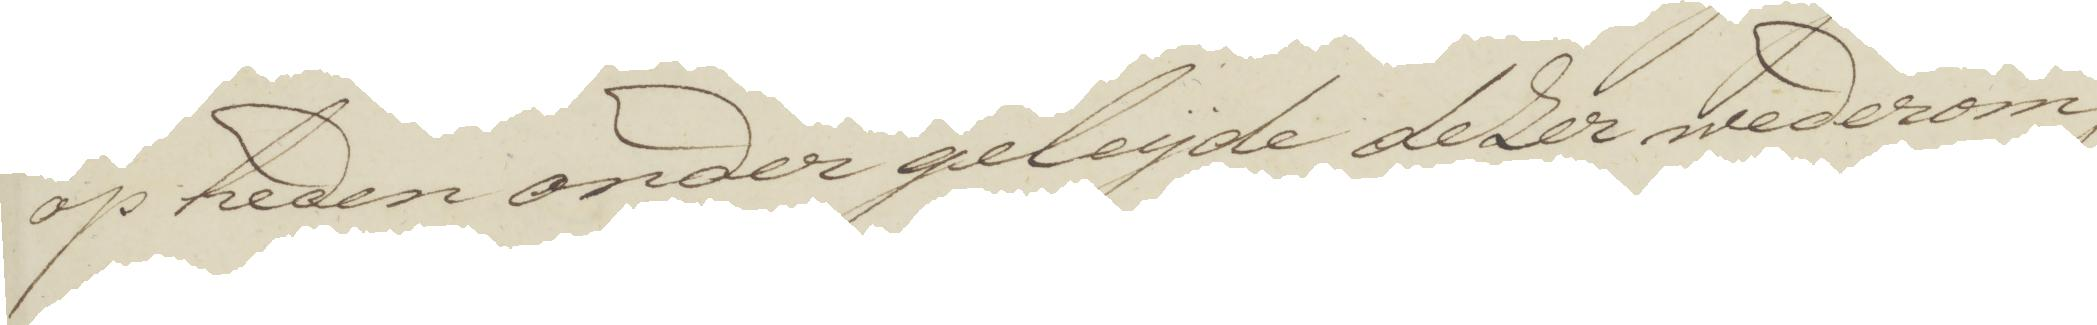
op heden onder geleijde dezer wederom
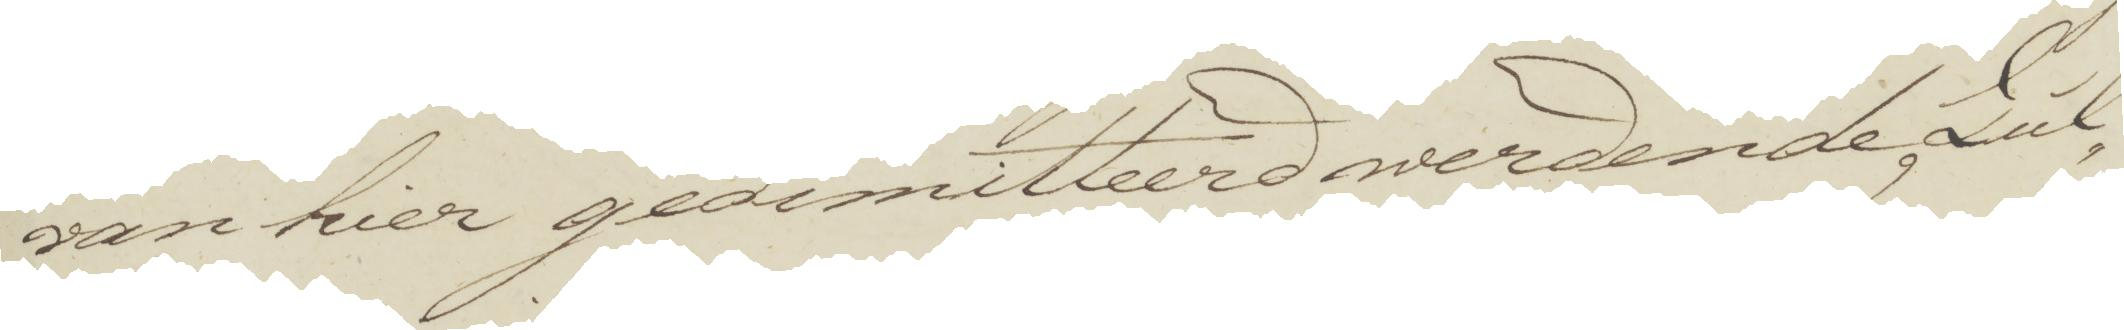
van hier gedimitteerd werdende, zul„
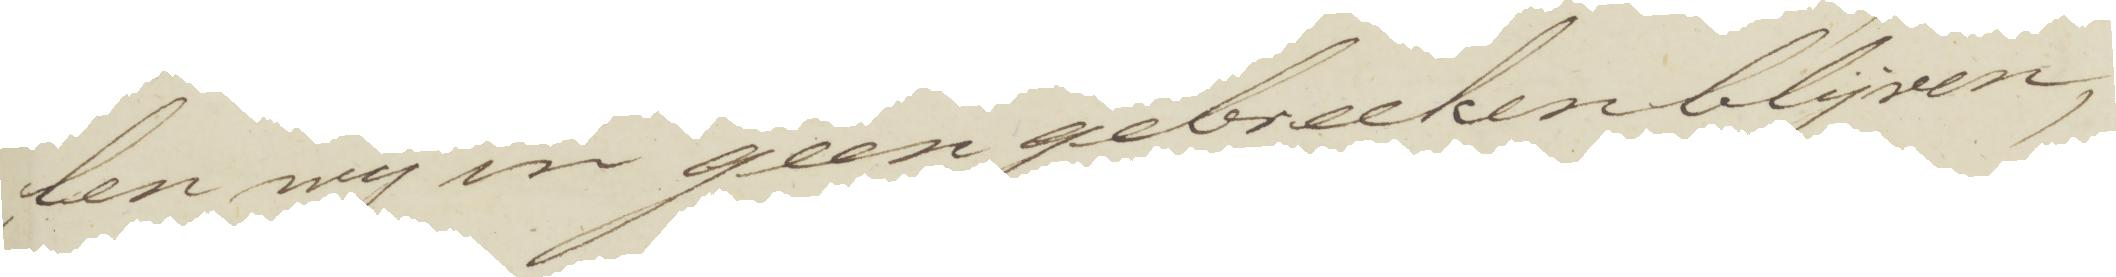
„len wij in geen gebreeken blijven,
